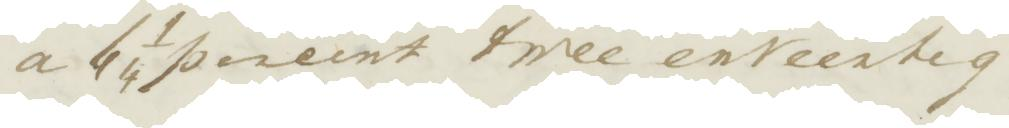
a 4¼ percent twee en Veertig
